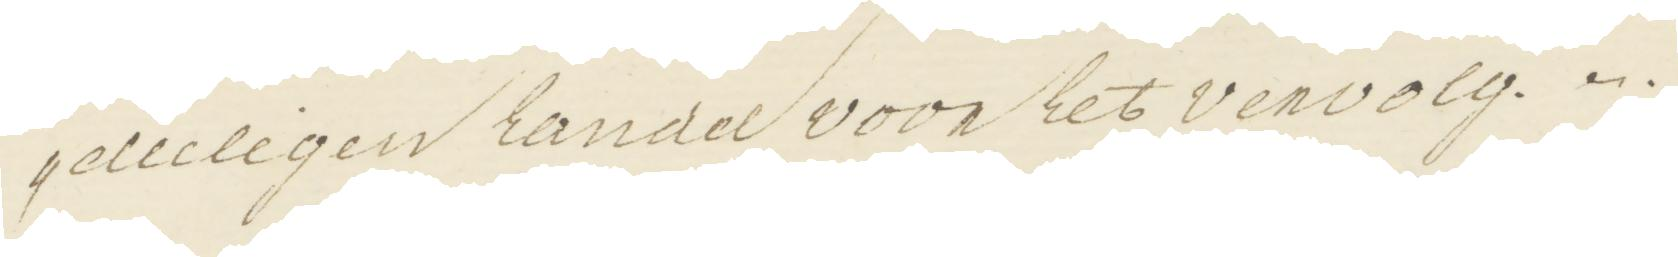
deeligen handel voor het vervolg. – .
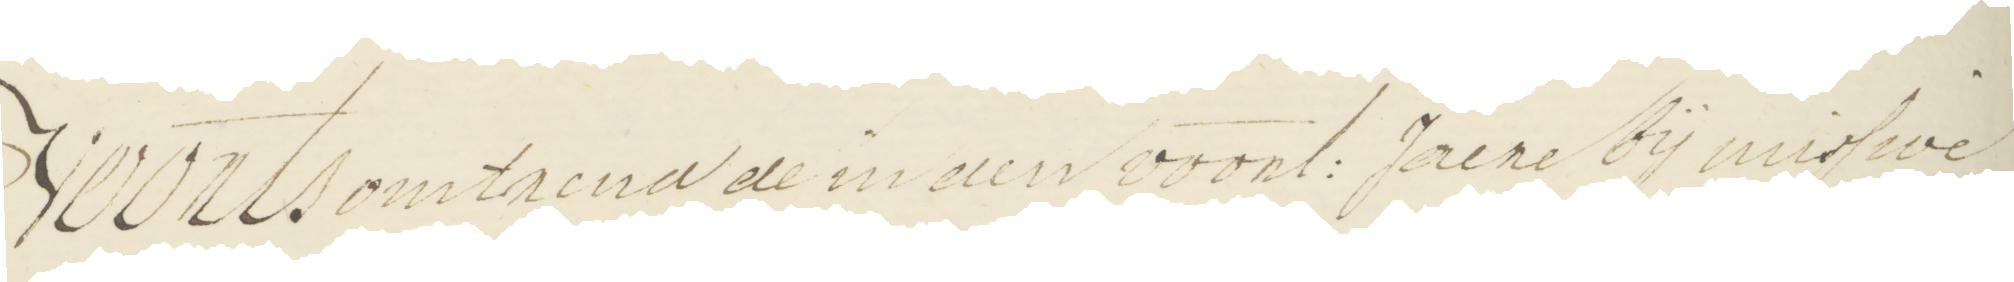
Voorts omtrend de in den voorl: Jaere bij missive
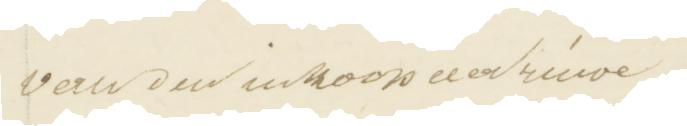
van den inkoop der ruwe
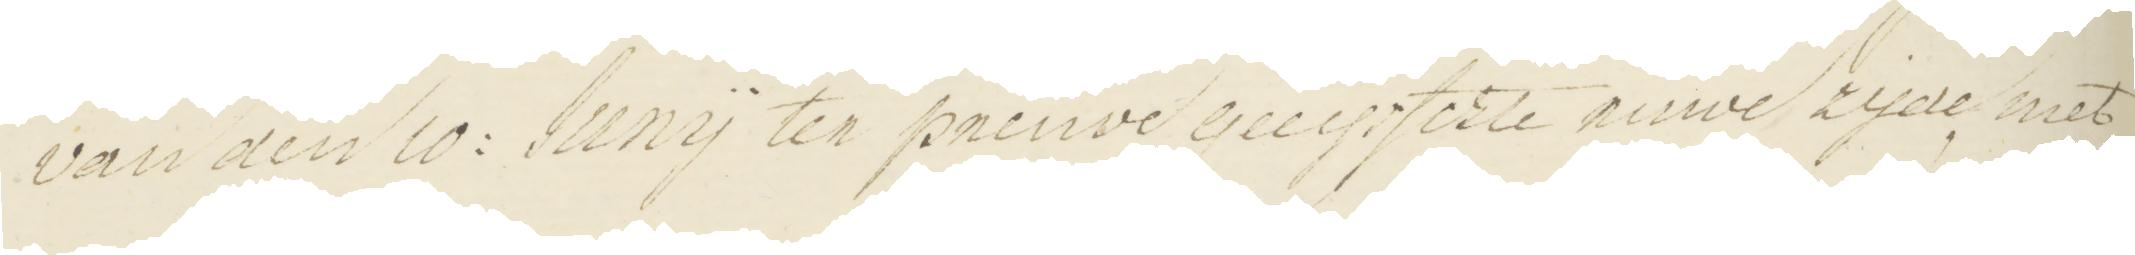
van den 10: Junij ter preuve geeijsschte ruwe zijde, met
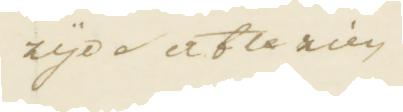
zijde af te zien
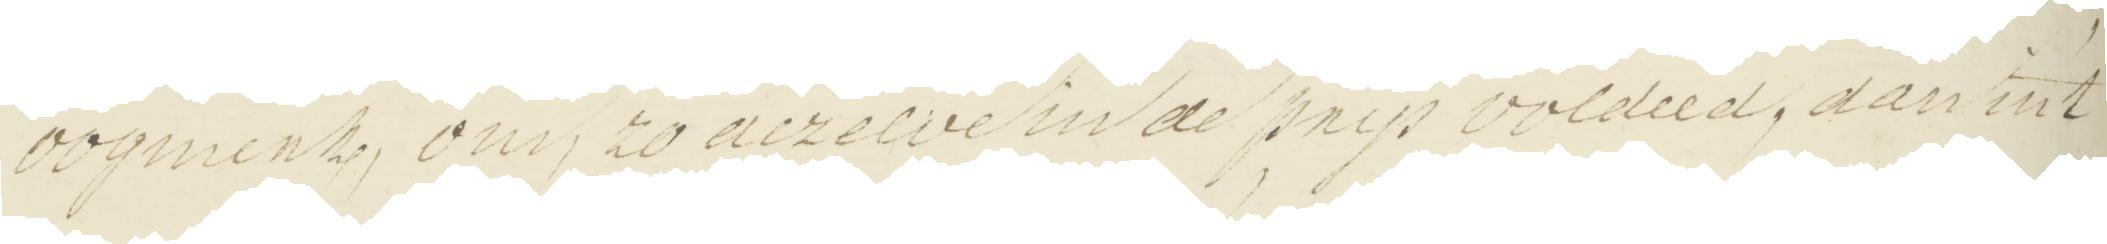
oogmerk, om, zo dezelve in de prijs voldeed, dan in't
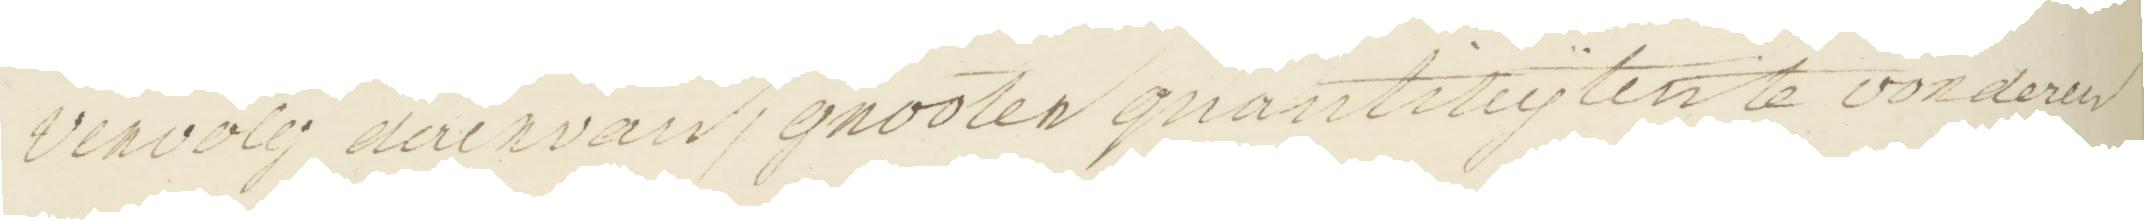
vervolg daervan, grooten quantiteijten te vorderen
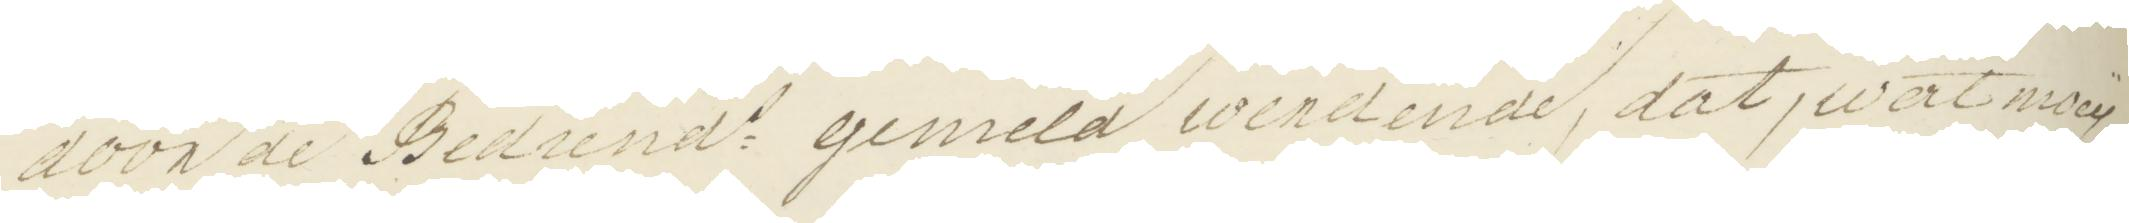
door de Bediend:s gemeld werdende, dat, wat moeij
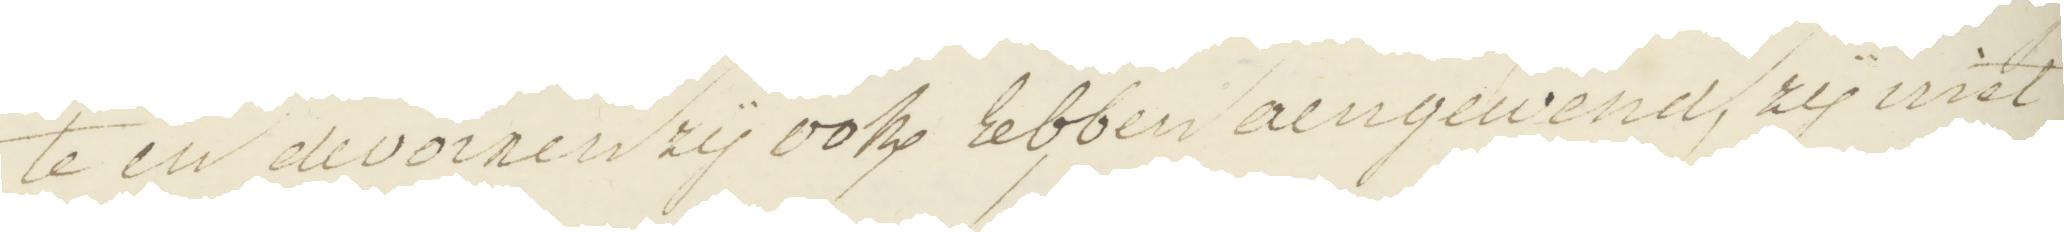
te en devoiren zij ook hebben aengewend, zij niet
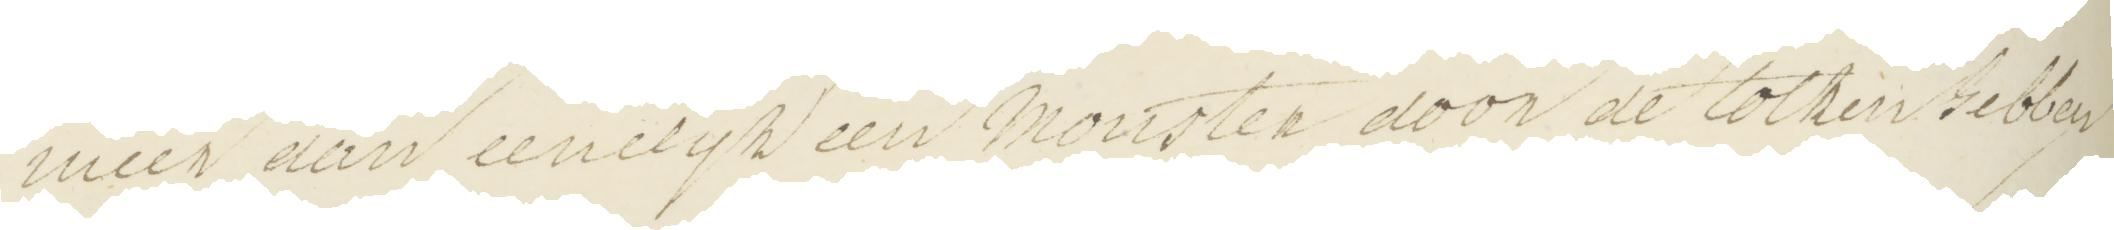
meer dan eenelijk een monster door de tolken hebben
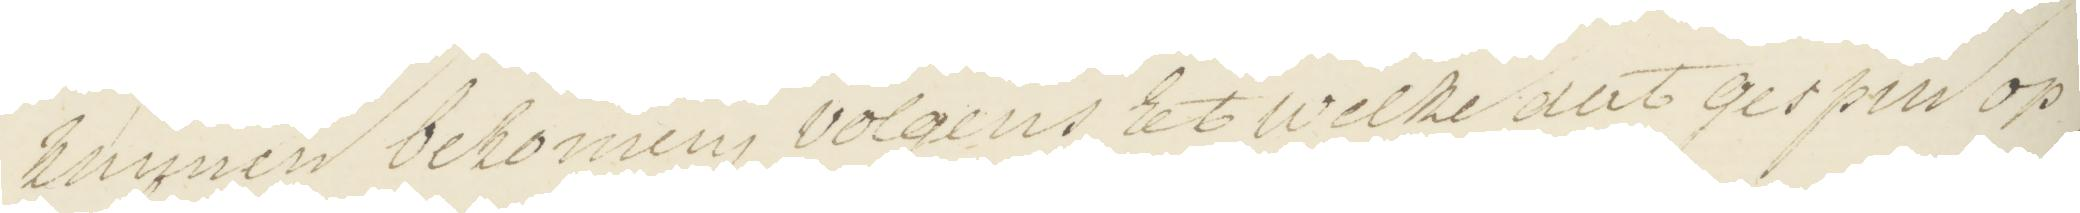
kunnen bekomen, volgens het welke dat gespin op
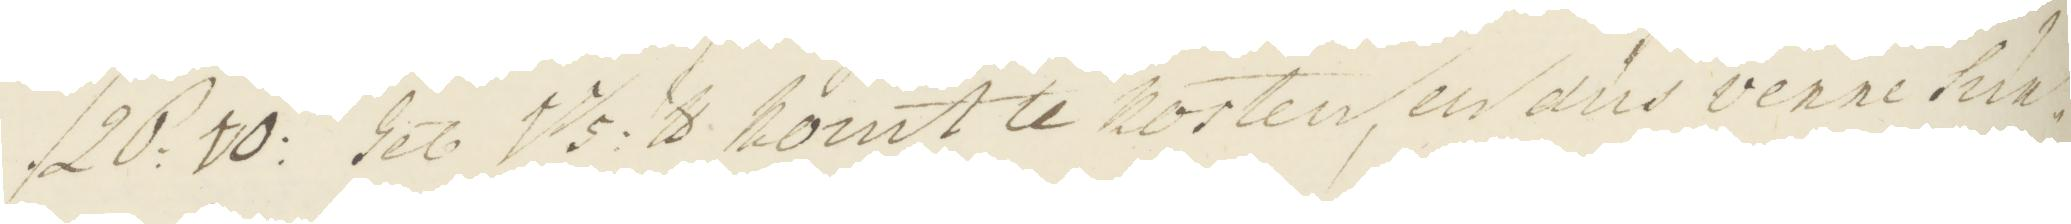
ƒ26: 10: het 1 1/5: 1/8 komt te korten, en dus verre sur„
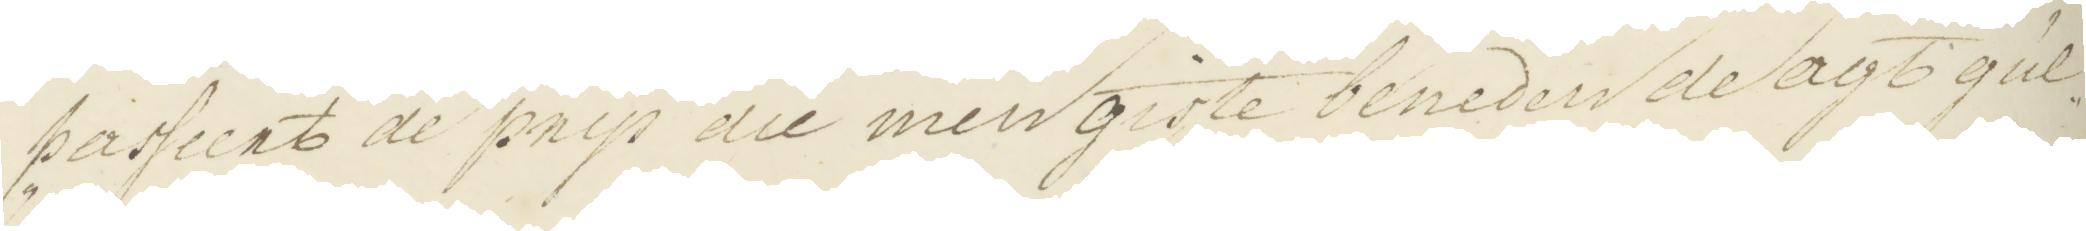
„passeert de prys die men giste beneden de agt gul„
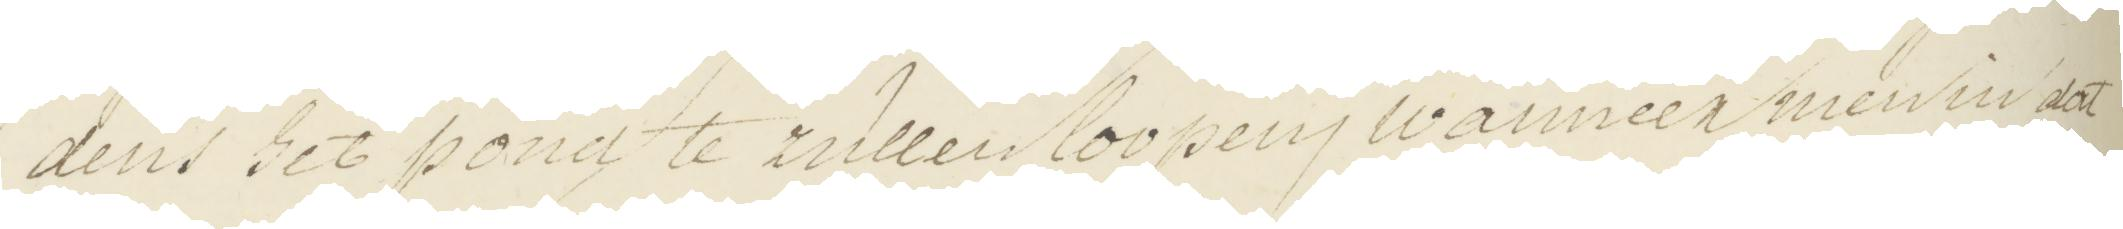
dens het pond te zullen loopen, wanneer men in dat
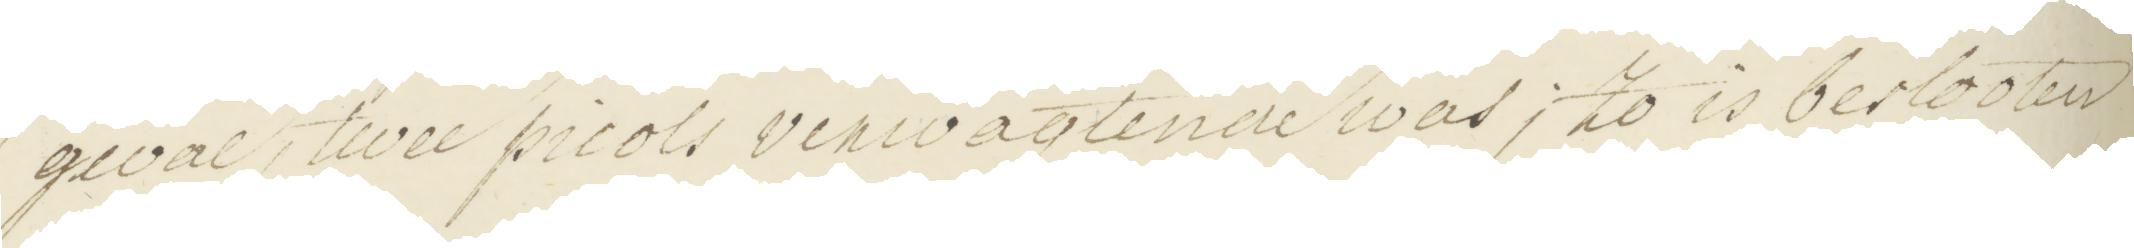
geval, twee picols verwagtende was; zo is beslooten
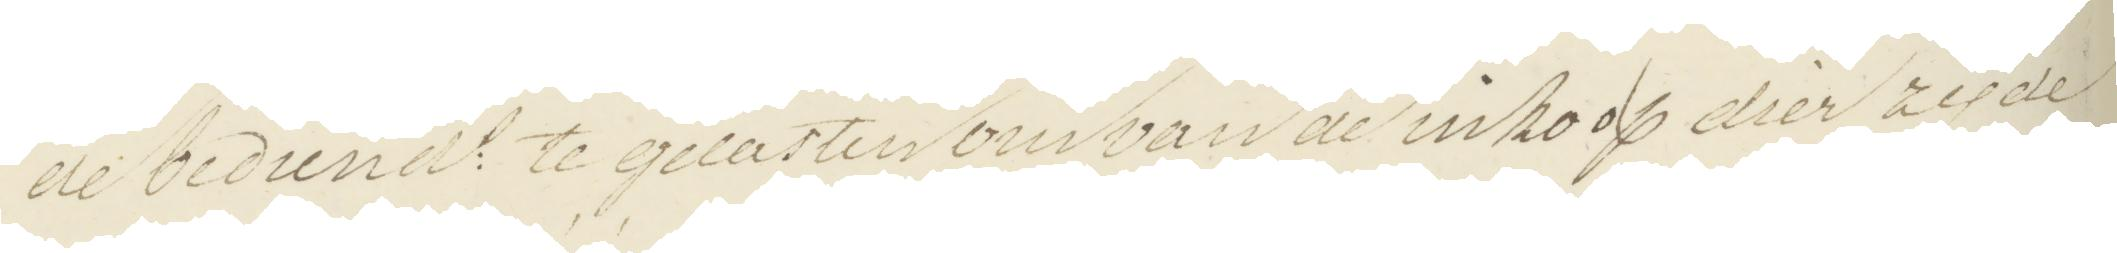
de bediend:s te gelasten om van de inkoop dier zyde
